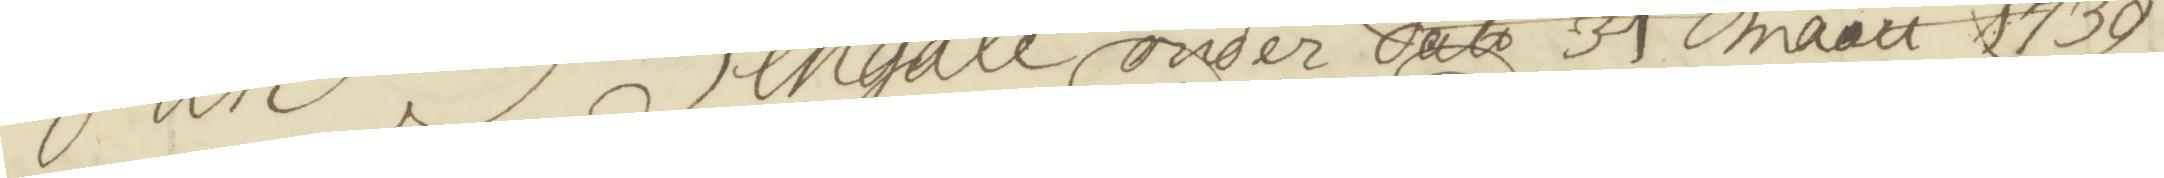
Van Bengale onder dato 31 maart 1739
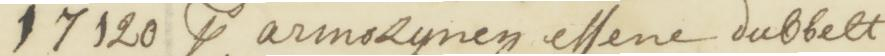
17120 ps armozynen essene dubbelt
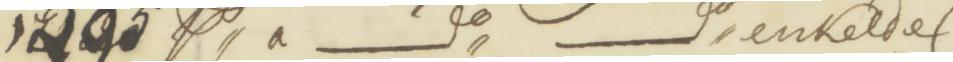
1295 p„s a D„o D„o enkelde
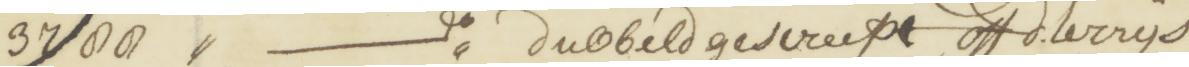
3788 „ D„o dubbeld gescreept off d: lerrijs
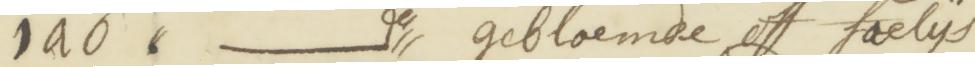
146 „ D„o gebloemde off foelijs
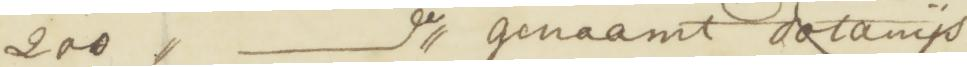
200 „ D„o genaamt datanijs
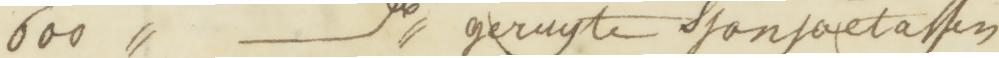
600 „ D„o geruyte sjonjoetassen
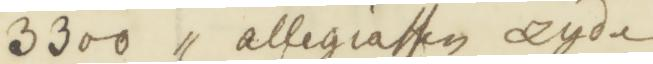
3300 „ allegiassen zyde
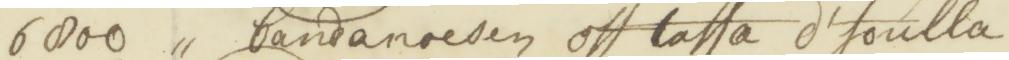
6800 „ bandanoesen off taffa d’ foulla
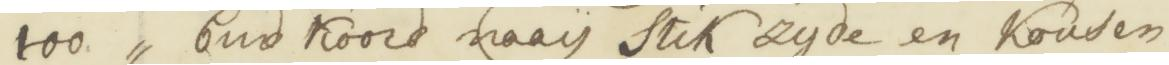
100 „ bud koord naaij stik zyde en kousen
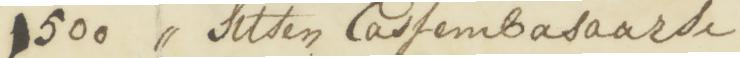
1500 „ sitsen Cassembasaarse
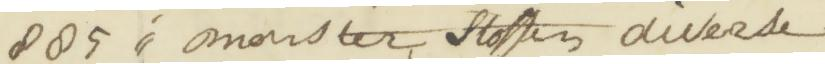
885 „ monster stoffen diverse
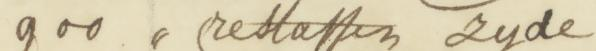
900 „ restaffen zijde
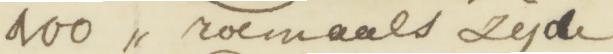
400 „ roemaals zijde
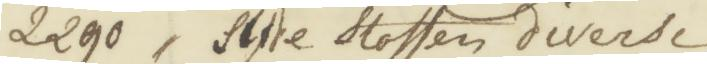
2290 „ Sijde stoffen diverse
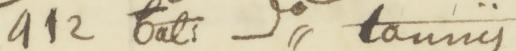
412 bal: D„o tannij
